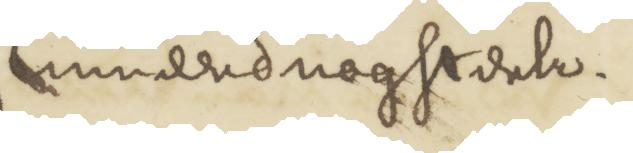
tinueerd nog sterk.
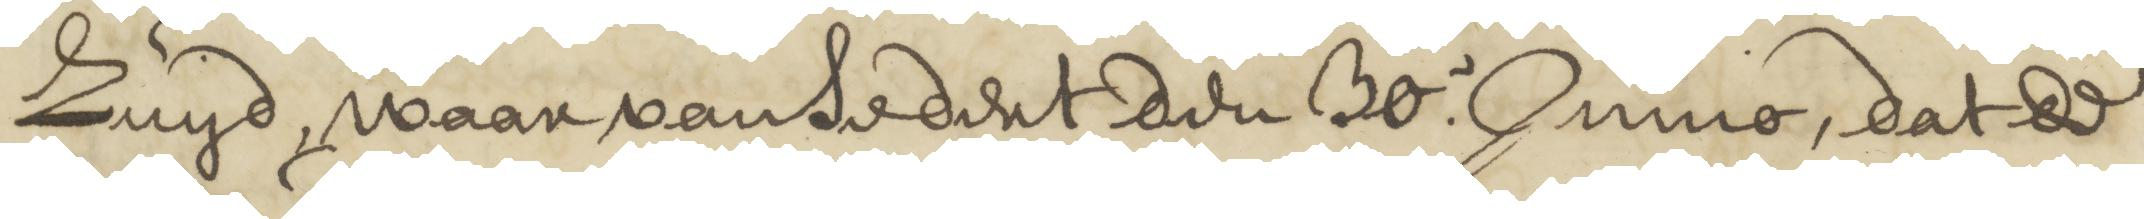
Zuijd, waar van sedert den 30.' Junio, dat de
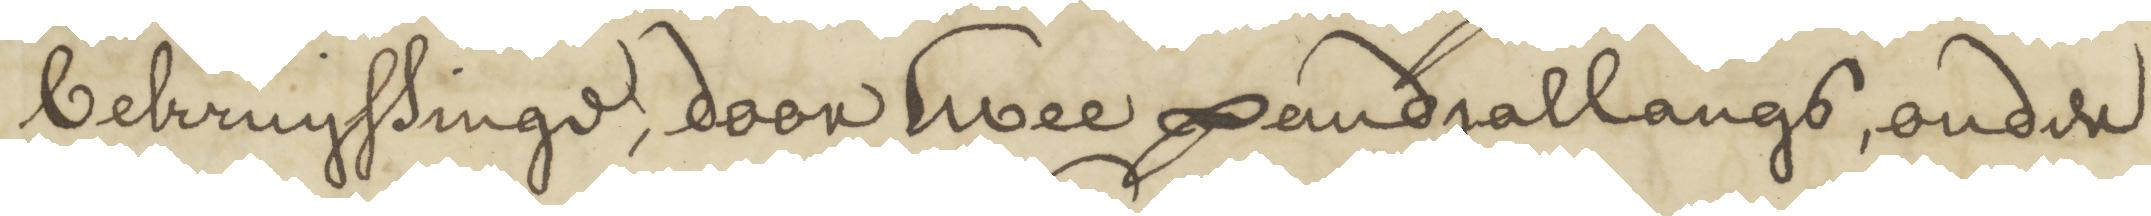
bekruijssinge, door twee pandjallangs, onder
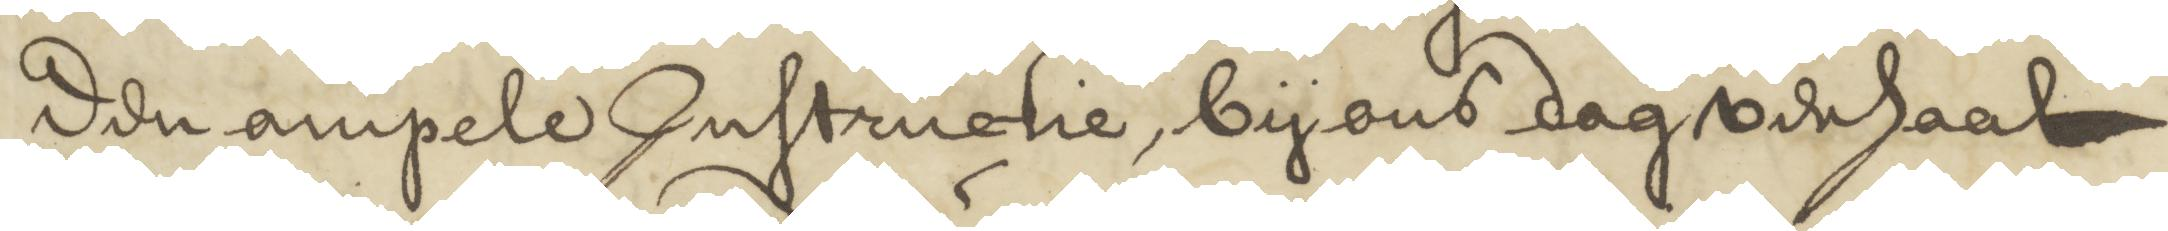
Een ampele Jnstructie, bij ons dagverhaal
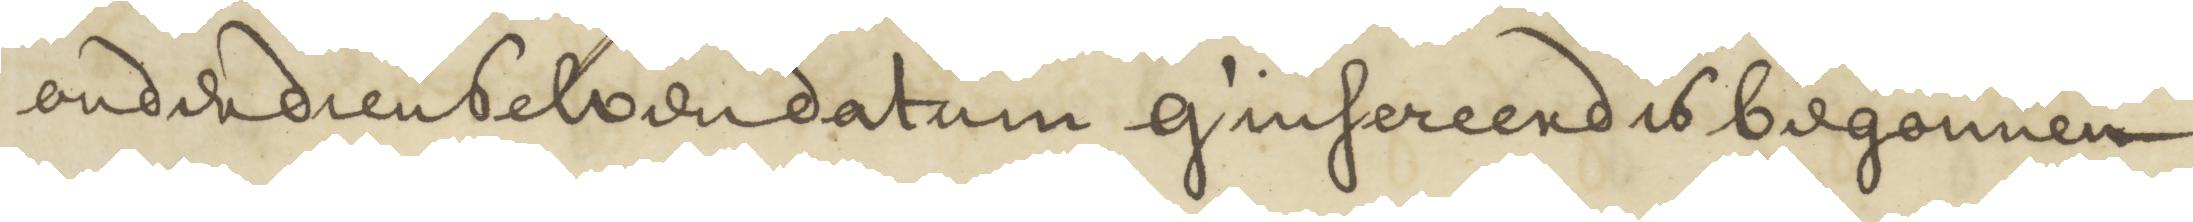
onder dienselven datum g’insereerd is begonnen
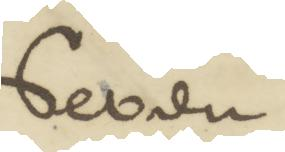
seven
